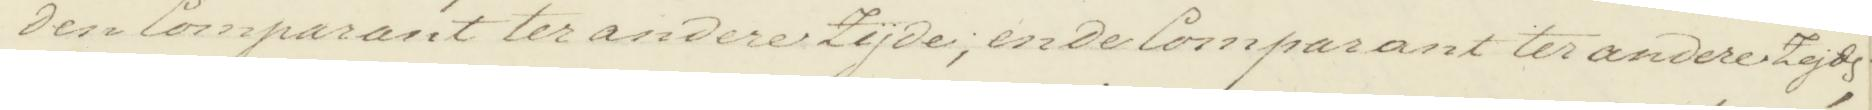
den Comparant ter andere Zijde, en de Comparant ter andere Zijden,
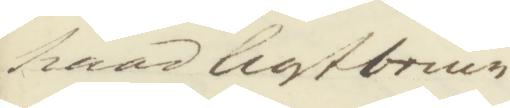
haar ligtbruin
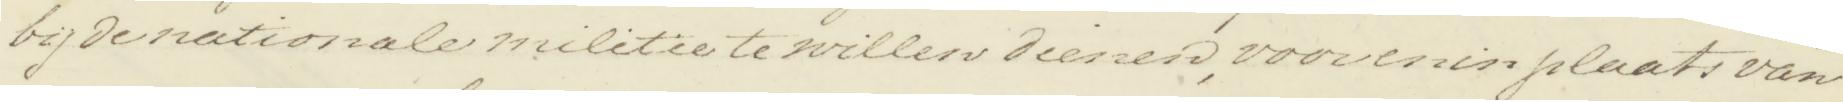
bij de nationale militie te willen dienen voor en in plaats van
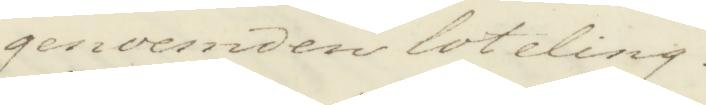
genoemden loteling
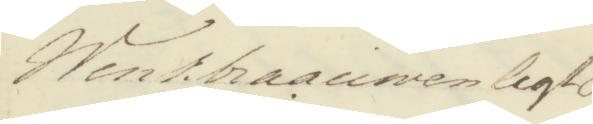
Wenkbraauwen ligt
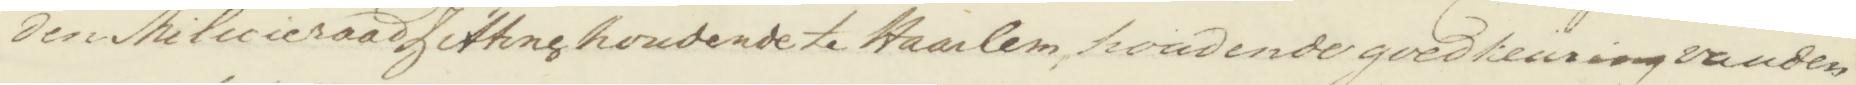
den Milicieraad Zitting houdende te Haarlem, houdende goedkeuring vanden
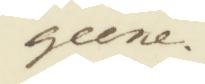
geene.
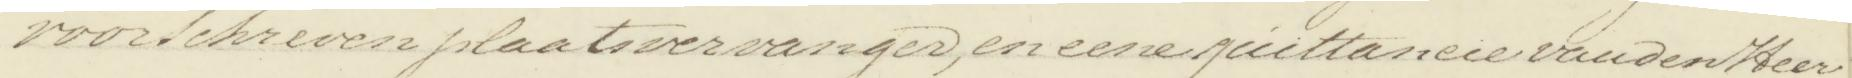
voorschreven plaatsvervanger, en eene quittancie vanden Heer
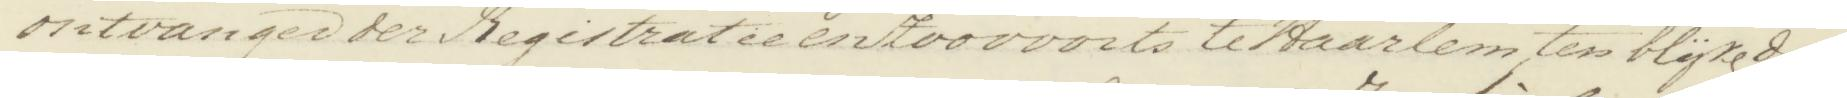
ontvanger der Registratie en Zoovoorts te Haarlem, ten blijken dat
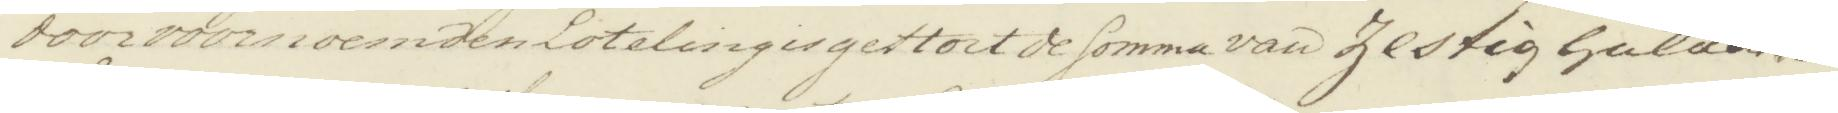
door voornoemden Loteling is gestort de somma van Zestig Gulden.-
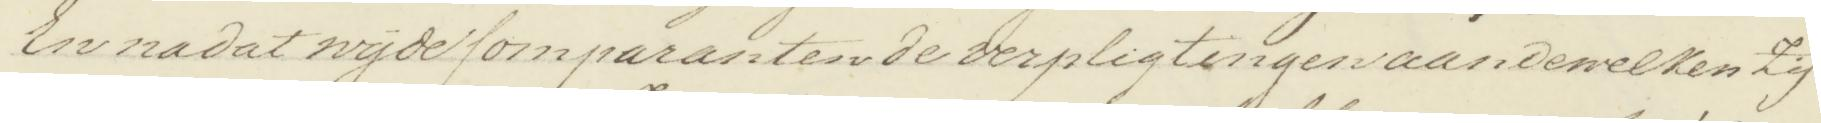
En nadat wij de Comparanten de verpligtingen aan dewelken Zij
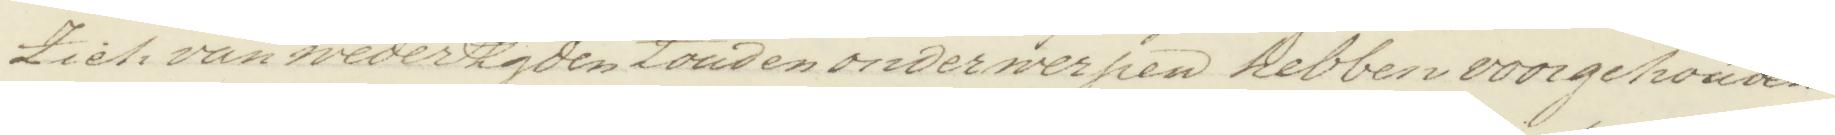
Zich van wederZyden Zouden onderwerpen hebben voorgehouden
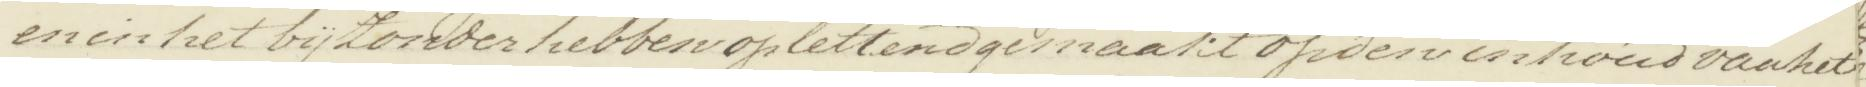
en in het bijZonder hebben oplettend gemaakt op den inhoud vanhet
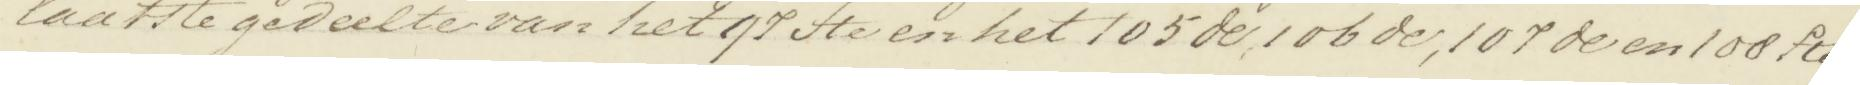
laatste gedeelte van het 97ste en het 105 de, 106 de, 107 de en 108 ste
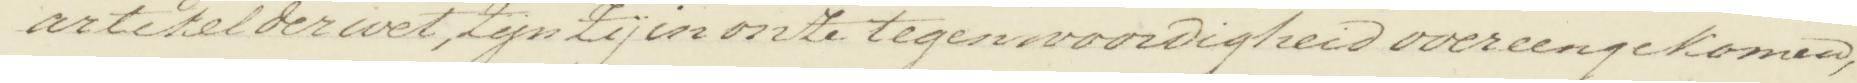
artikel der wet, Zijn Zij in onZe tegenwoordigheid overeengekomen,
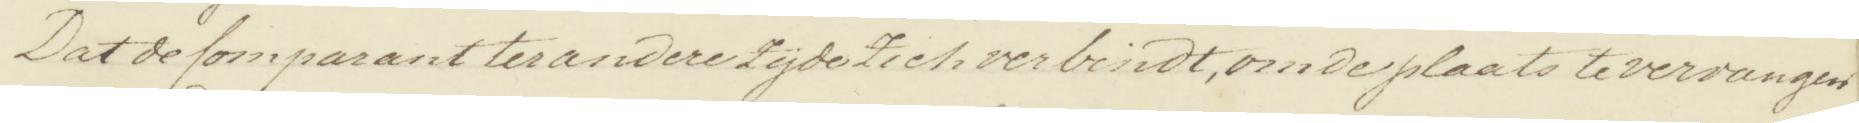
Dat de Comparant ter andere Zijde Zich verbindt, om de plaats te vervangen
